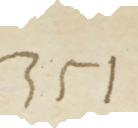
351
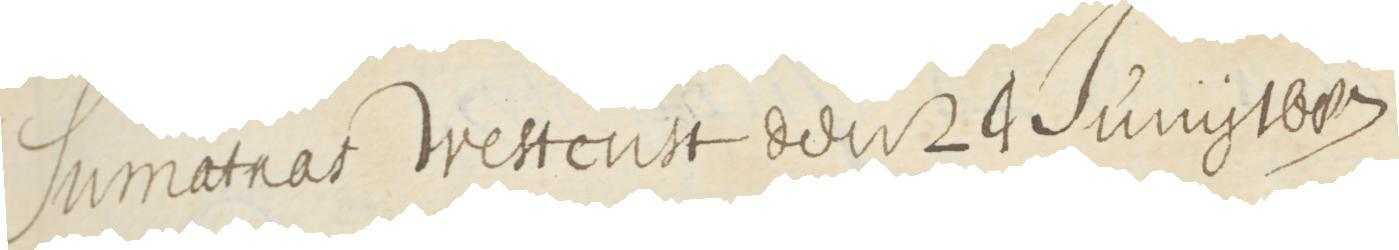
Sumatras westcust den 24 Junij 1687
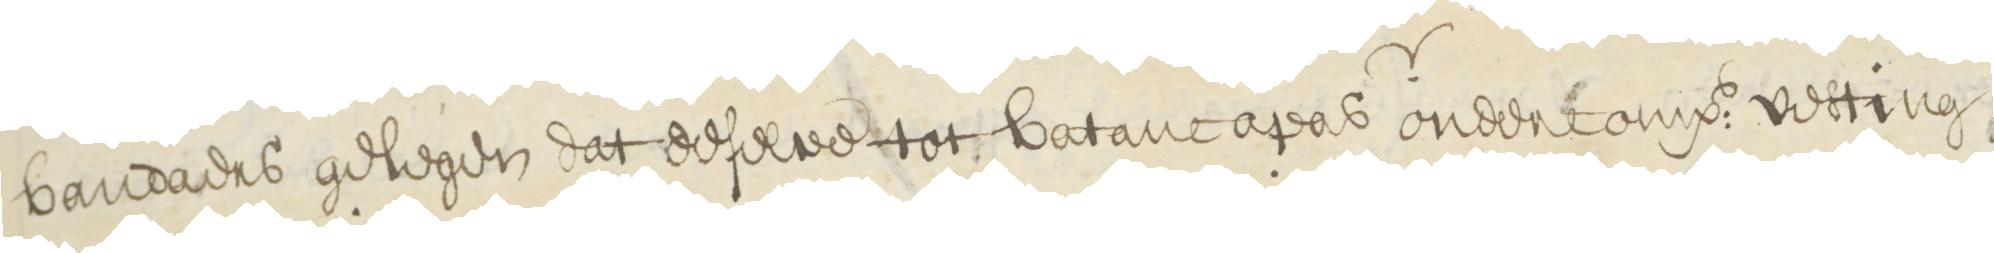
bandaers gelegen dat deselve tot batan capas onder comp:s vesting
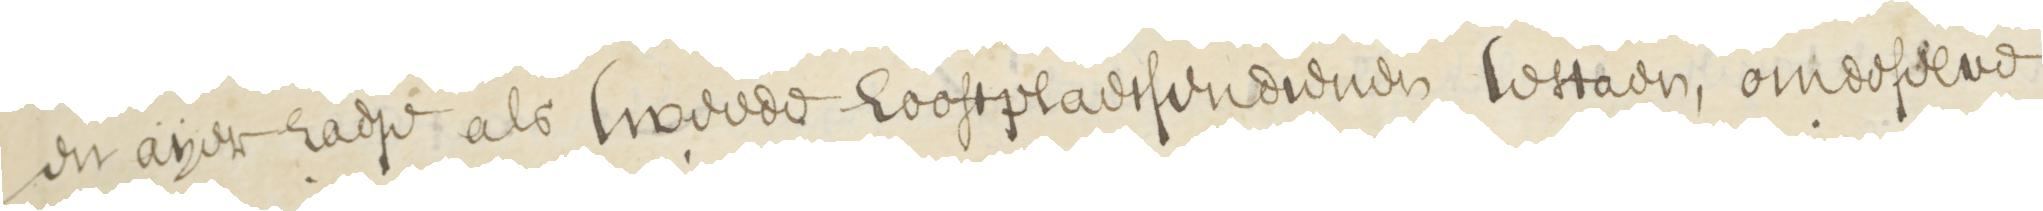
en aijer radje als tweede hooftplaetsen dienen te staen, om deselve
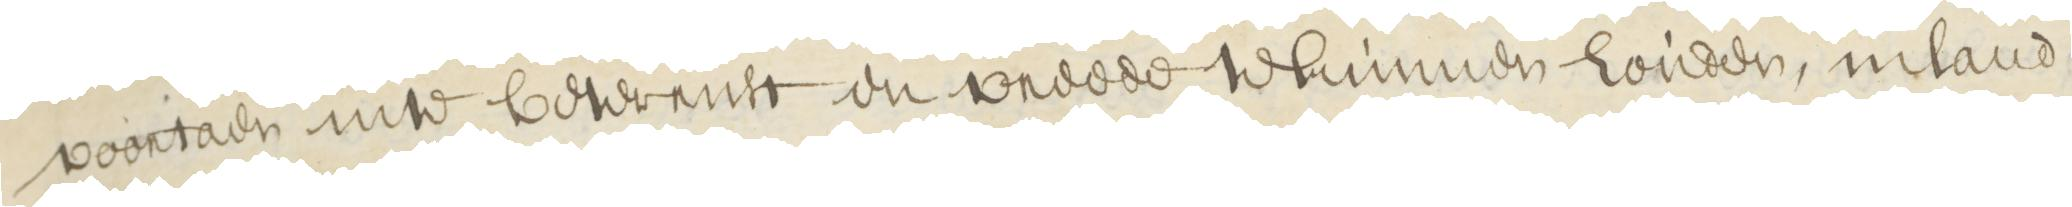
voortaen in te beter rust en vreede te kunnen houden, in land
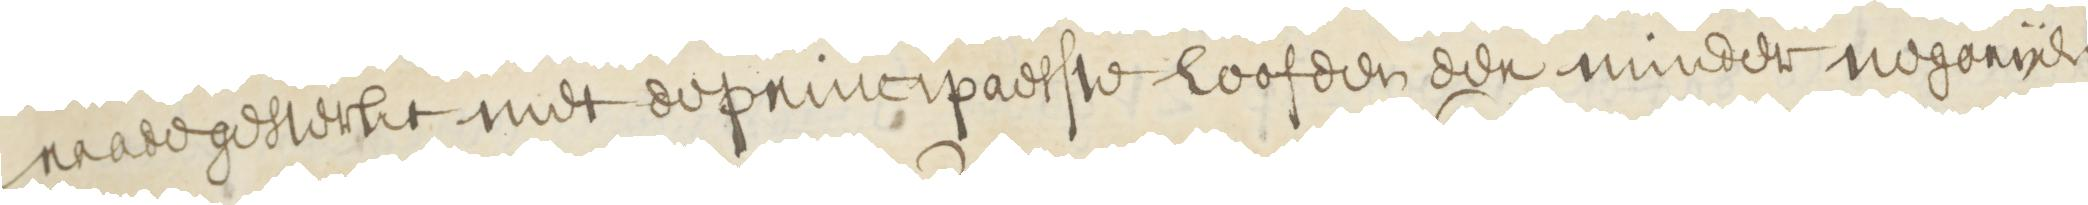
raade gesterkt met de principaelste hoofden der minder negorijen
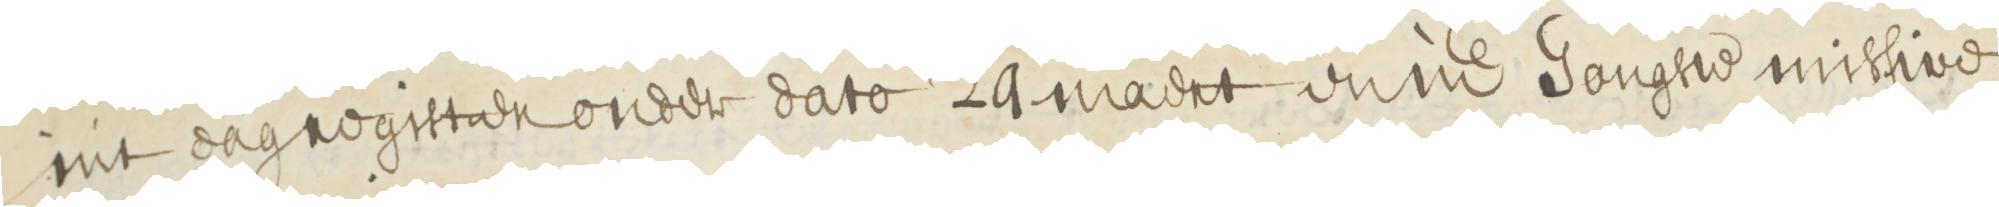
in ’t dag register onder dato 24 maert en uE Iongste missive
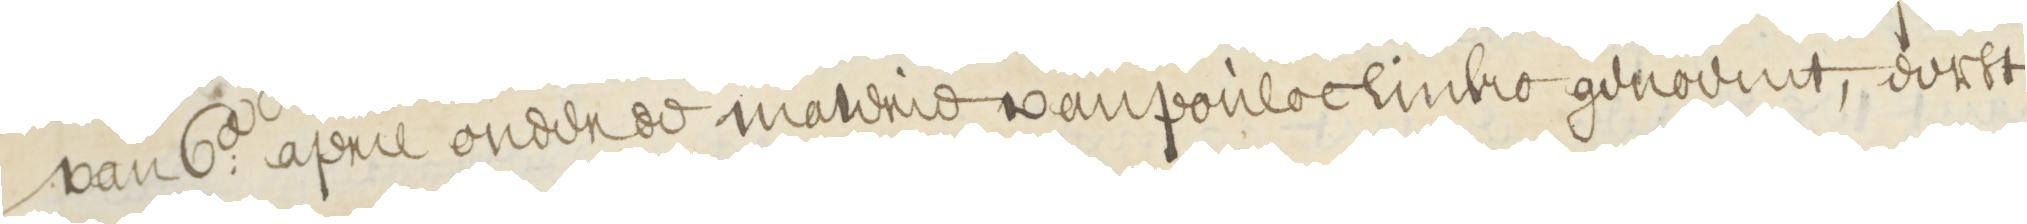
van 6:e april onder de materie van poulo chinko genoemt, eerst
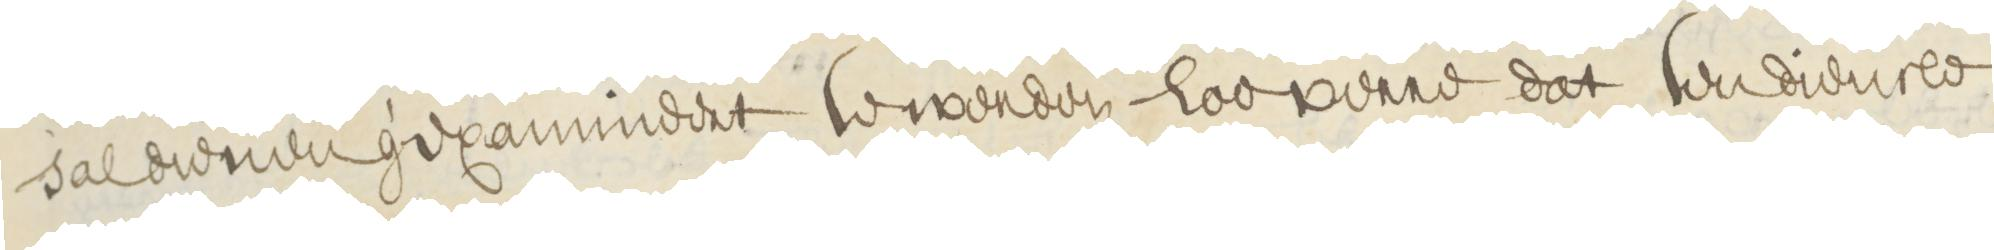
sal dienen g'examineert te werden hoe verre dat ten dienste
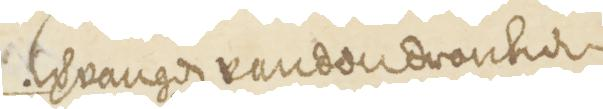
t vervangen van den dronken
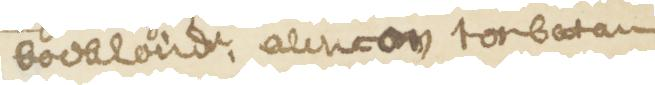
boekhouder alecon tot batan
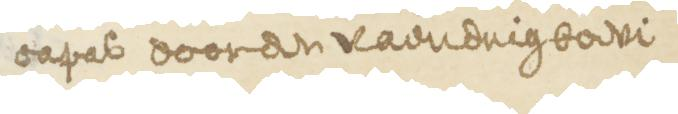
capas door den vaendrig boevi
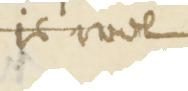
is wel
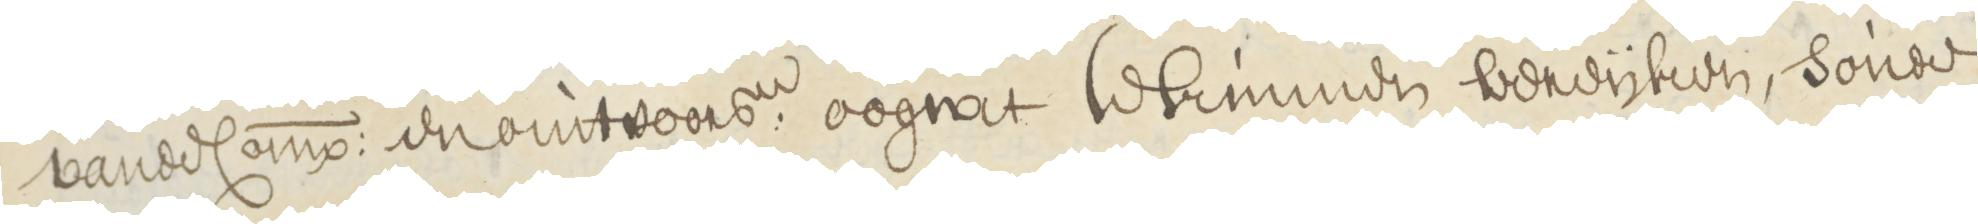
van de Comp: en om 't voors:e oogwit te kunnen bereijken, soude
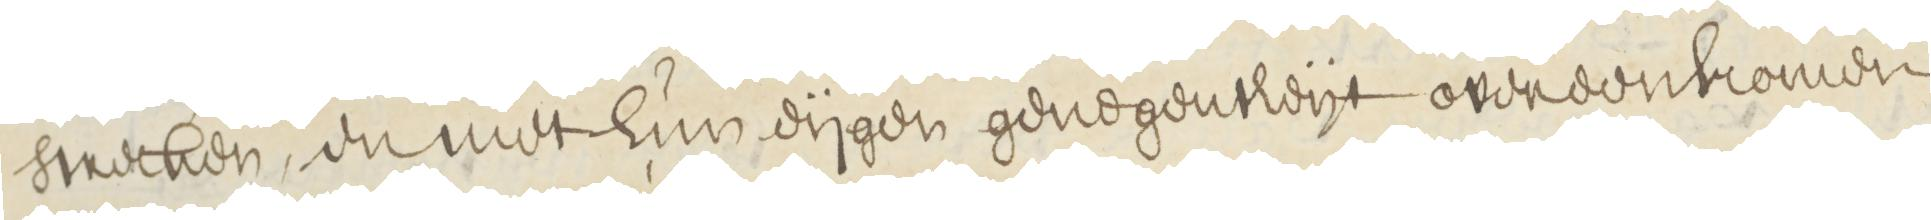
strecken, en met hun eijgen genegentheijt overeen komen
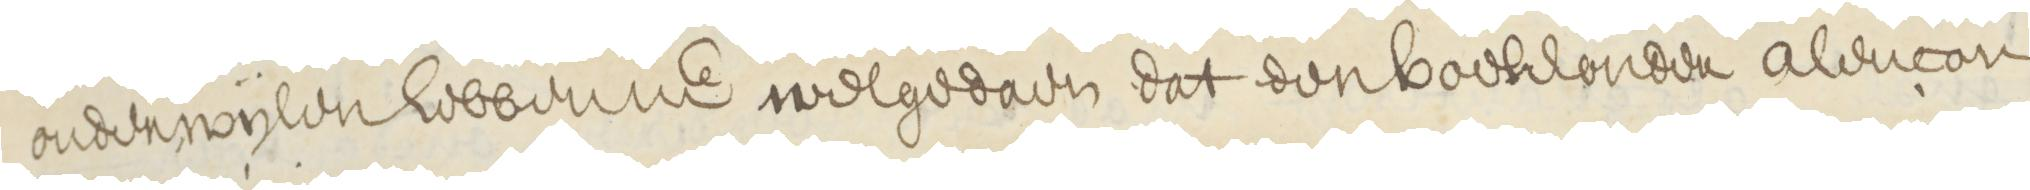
onderwijlen hebben uE welgedaen dat den boekhouder alencon
